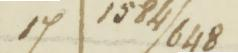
17 1584/648
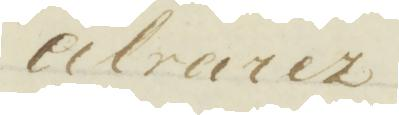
Alvarez
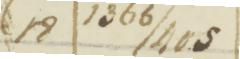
18 1366/405
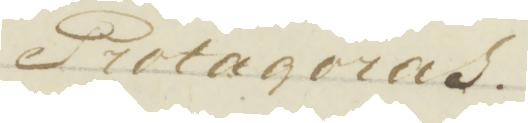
Protagoras.
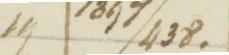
19 1897/438.
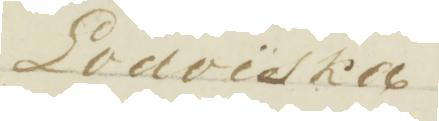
Lodoïska
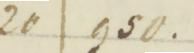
20 950.
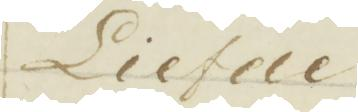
Liefde
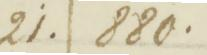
21. 880.
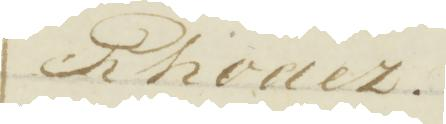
Rhodez.
